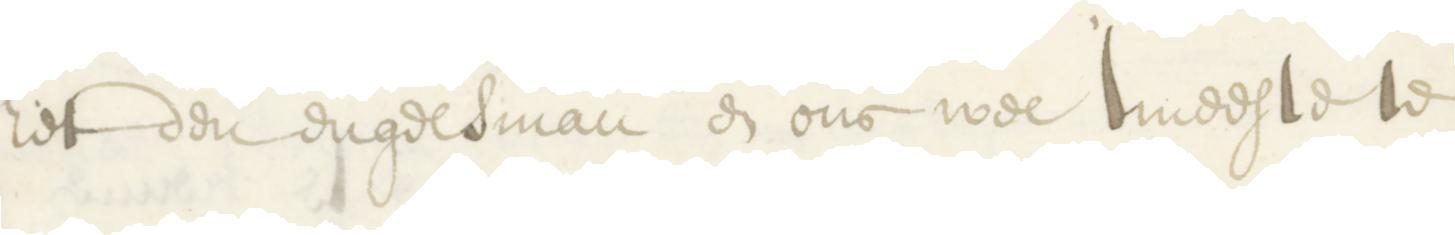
het den engelsman en ons wel 'tmeeste te
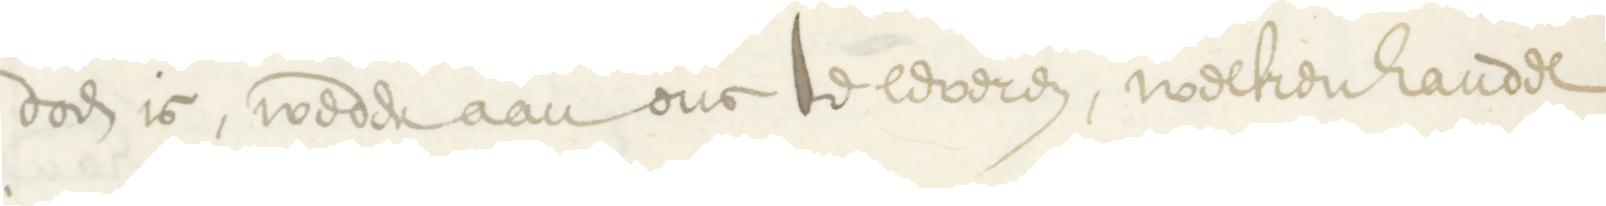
doen is, weder aan ons te leveren, welken handel
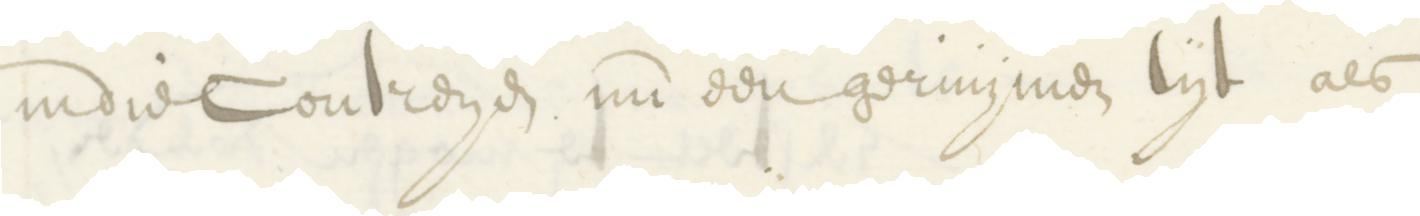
in die contreijen nu een geruijmen tijt als
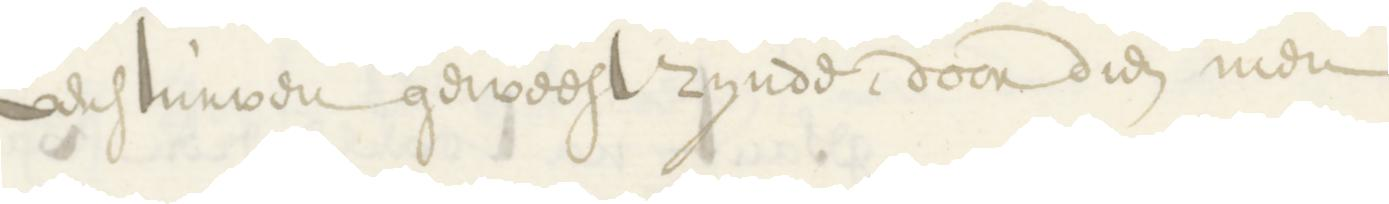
versturven geweest zijnde, door dien men
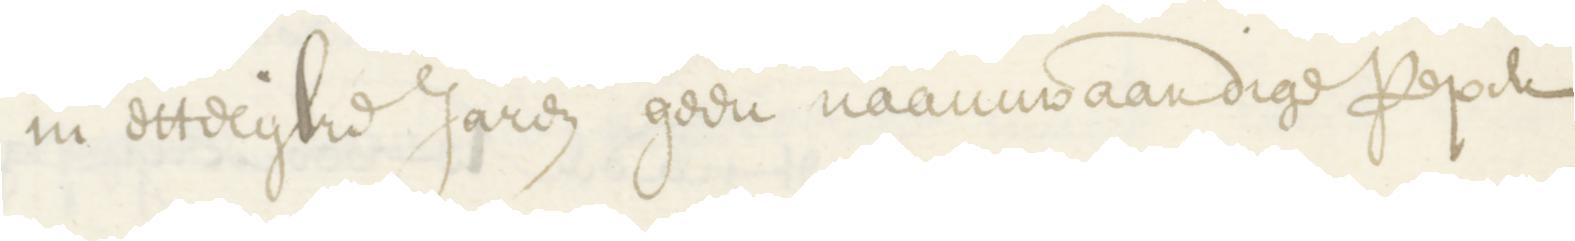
in ettelijke Jaren geen naamwaardige Peper
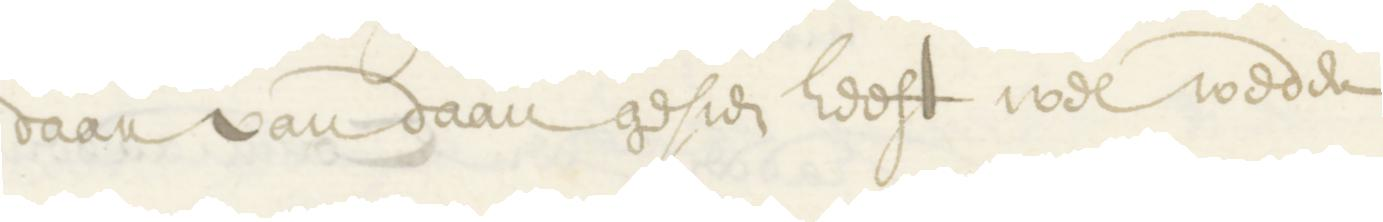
daar van daan gesien heeft wel weder
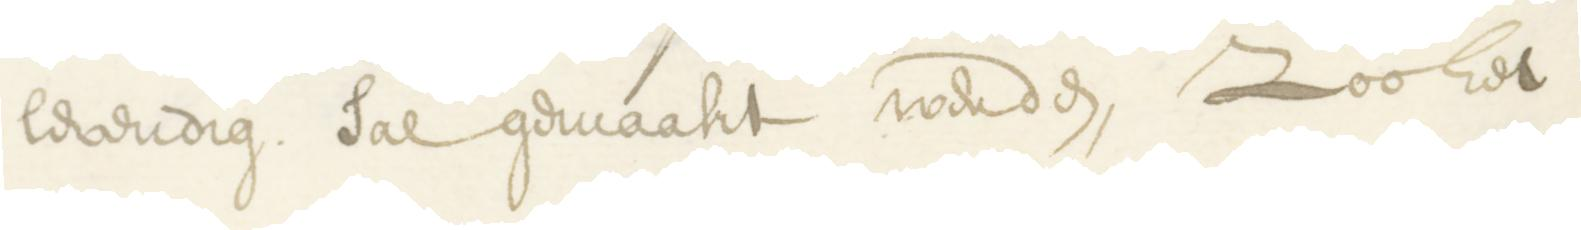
levendig. sal gemaakt werden, zoo het
